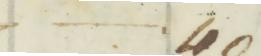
- - .40
